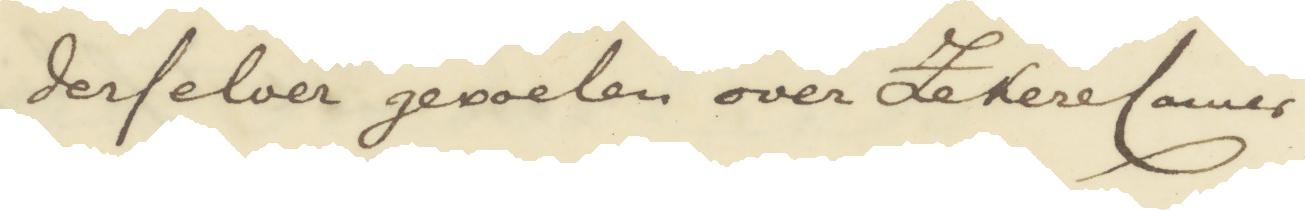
derselver gevoelen over zekere Comes
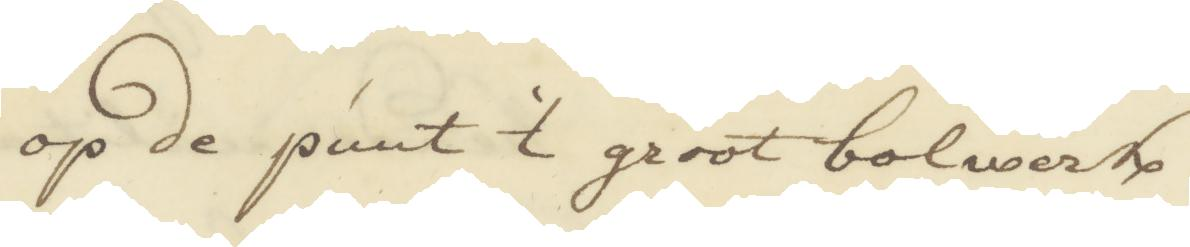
op de punt ’t groot bolwerk
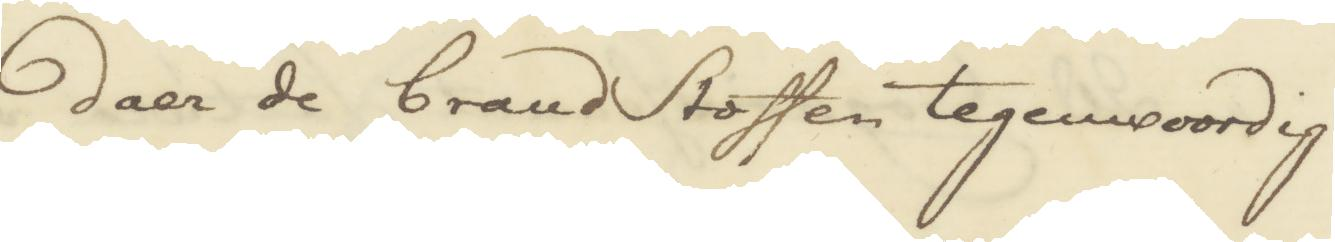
daar de brandstoffen tegenwoordig
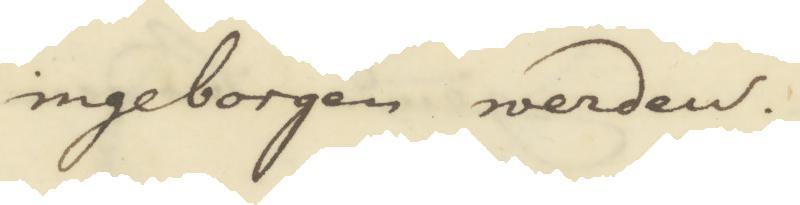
ingeborgen werden.
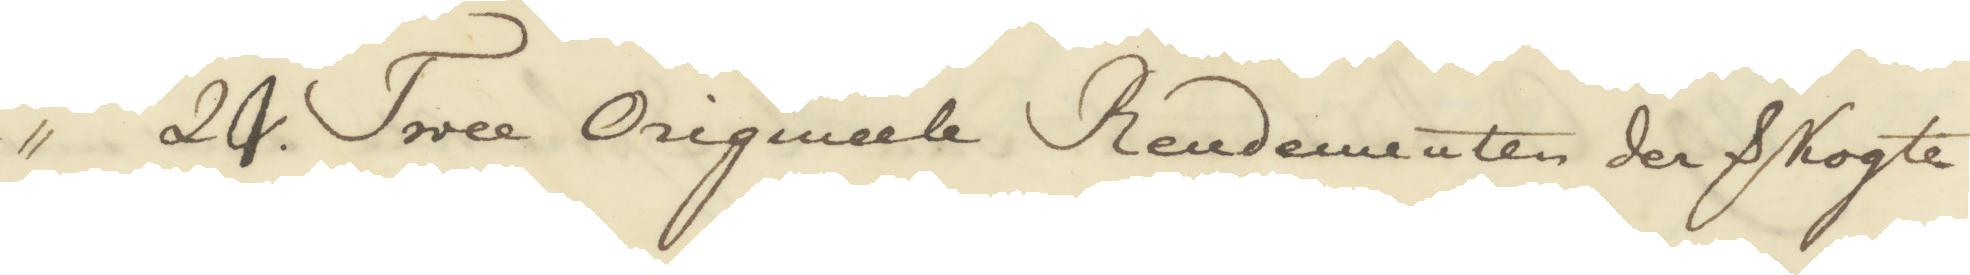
„ 24. Twee Origineele Rendementen der verkogte
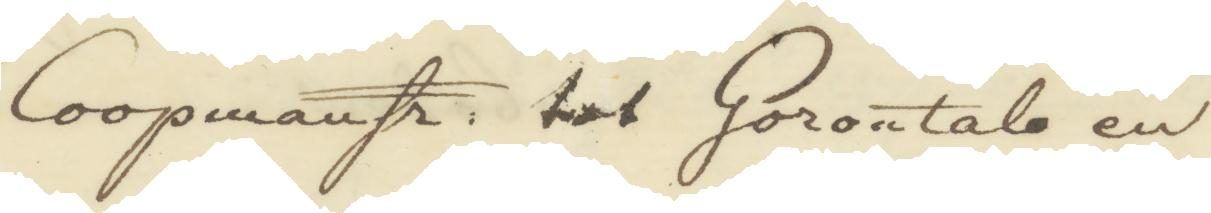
Coopmansz: tot Gorontalo en
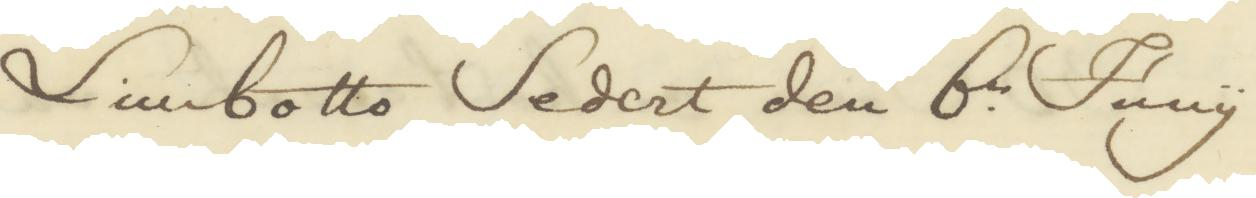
Limbotto Sedert den 6.n Iunij
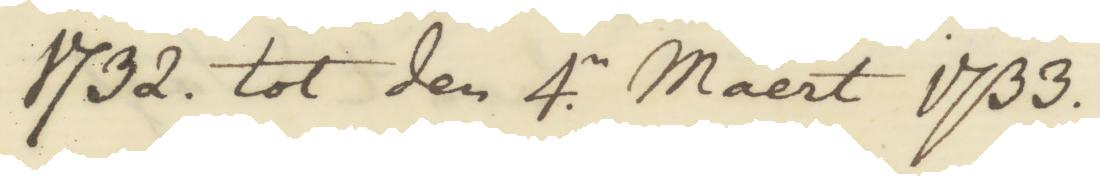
1732. tot den 4.n Maert 1733.
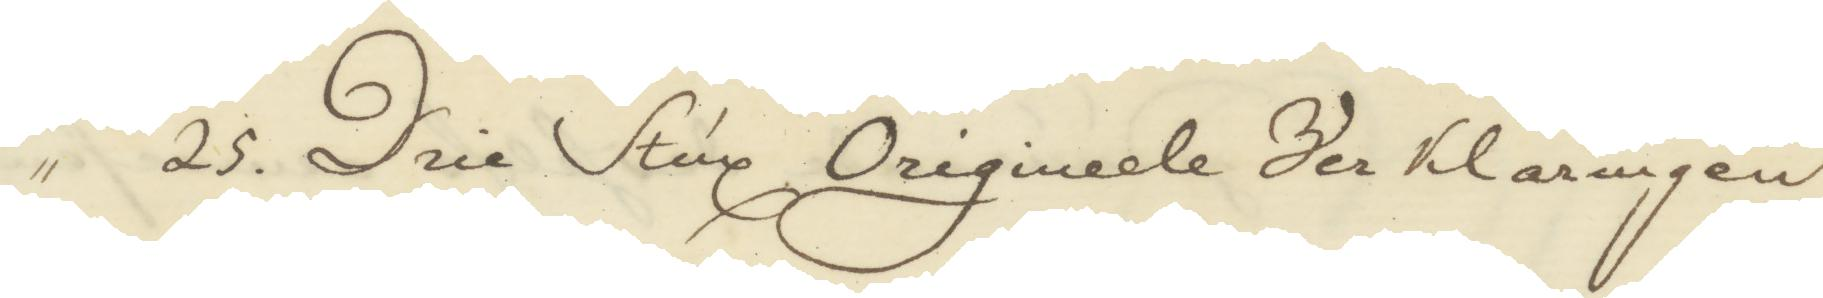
„ 25. Drie stux Origineele Verklaringen
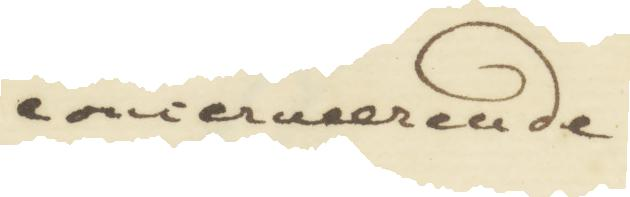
concerneerende
